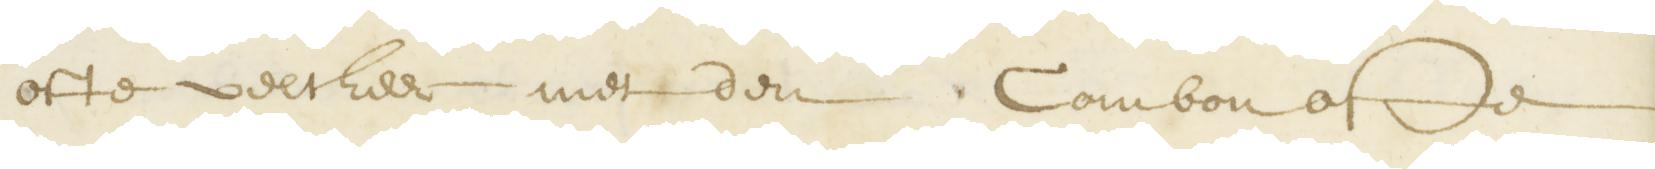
ofte veltheer met den combon ofte
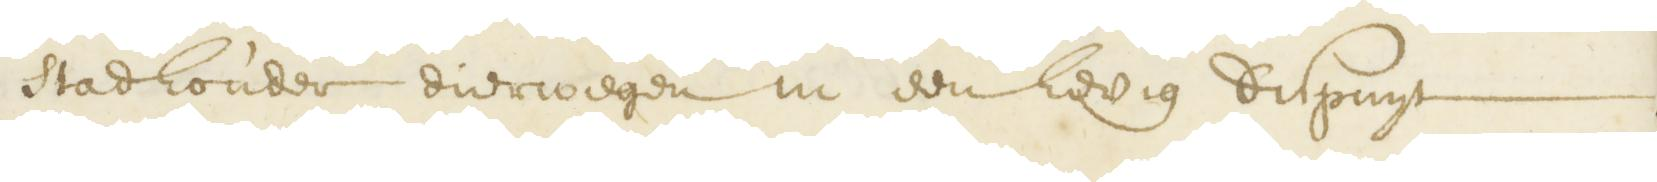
stadhouder dierwegen in een hevig dispuijt
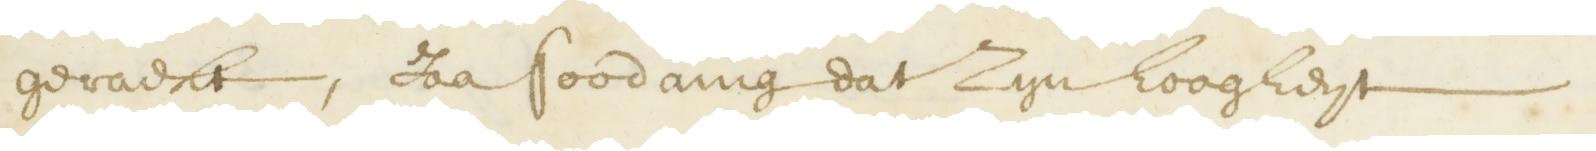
geraekt, Jaa soodanig dat zijn hoogheijt
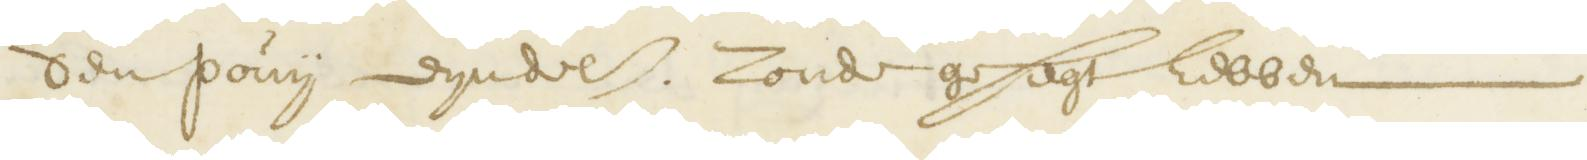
den pouij eijndelijk zonde gesegt hebben
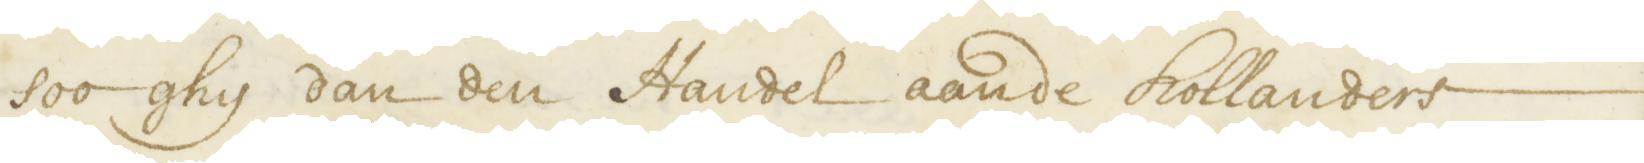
soo ghij dan den Handel aan de Hollanders
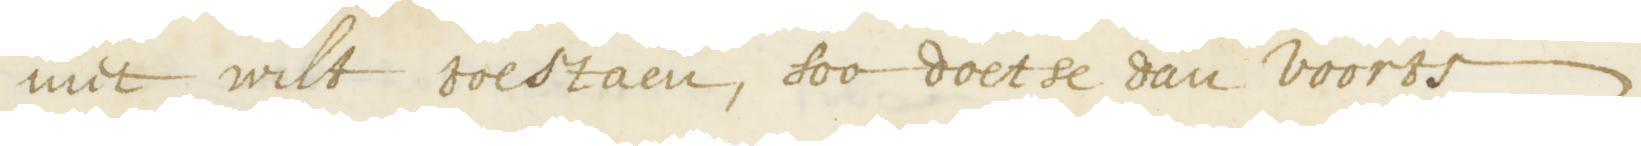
niet wilt toestaen, soo doetse dan voorts
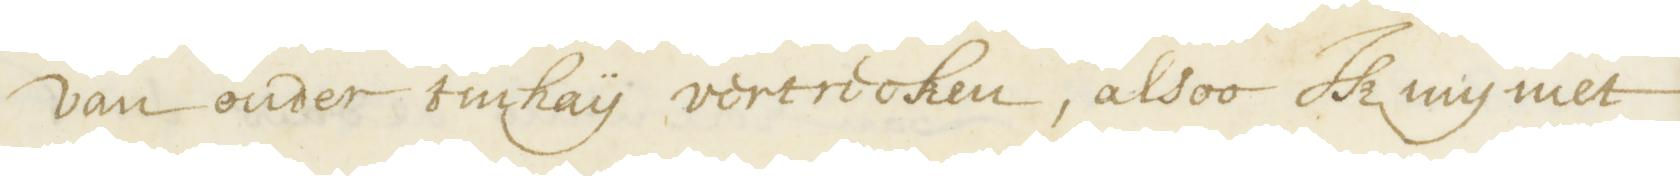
van ouder tinhaij vertrecken, alsoo Ik mij met
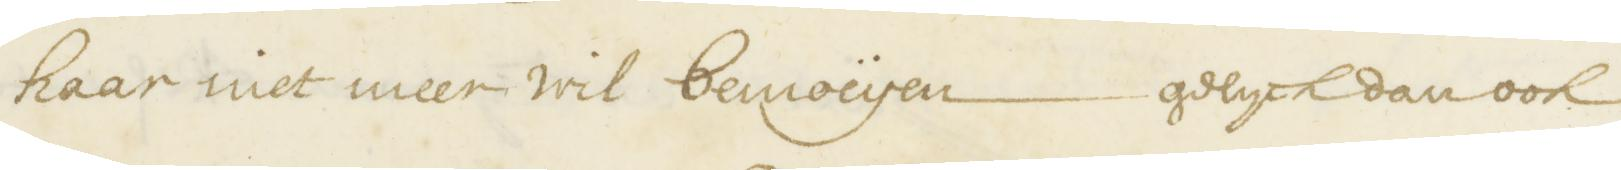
haar niet meer wil bemoeijen gelijck dan ook
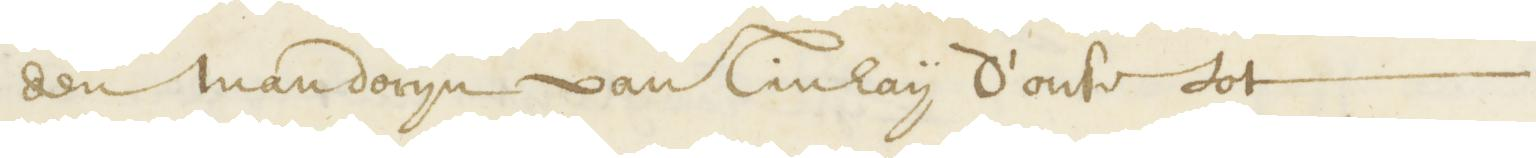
den mandorijn van Tinhaij d’ onse tot
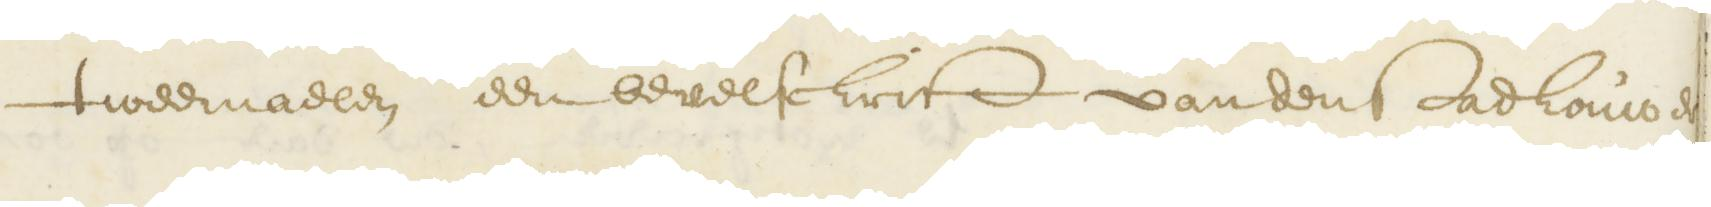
tweemaelen een bevelschrift van den stadhouwer
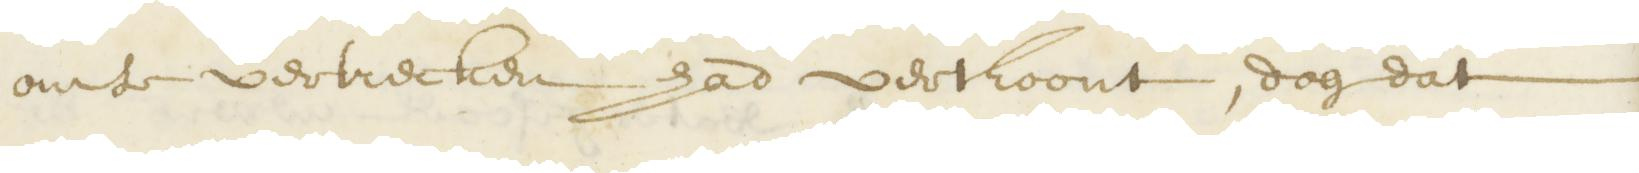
om te vertrecken had verthoont, dog dat
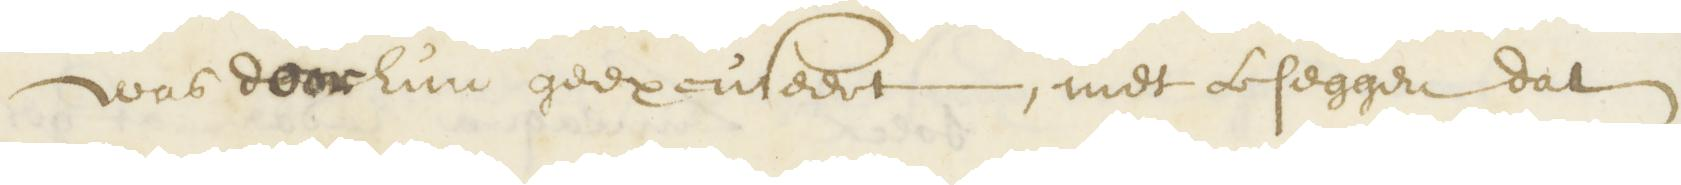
was doorhun geexcuseert, met teseggen dat
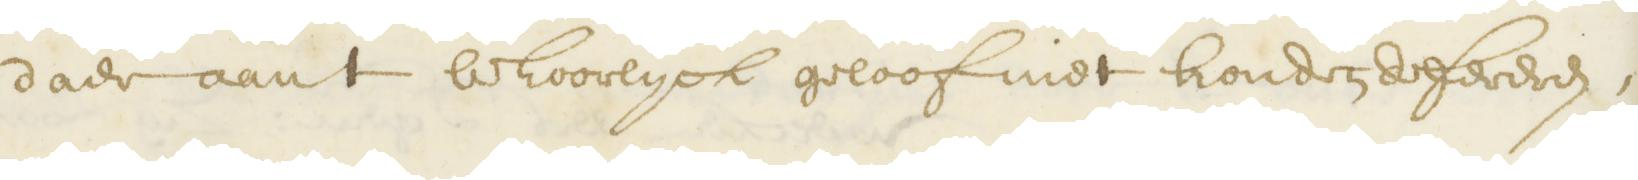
daer aant behoorlijck geloof niet konden defereren,
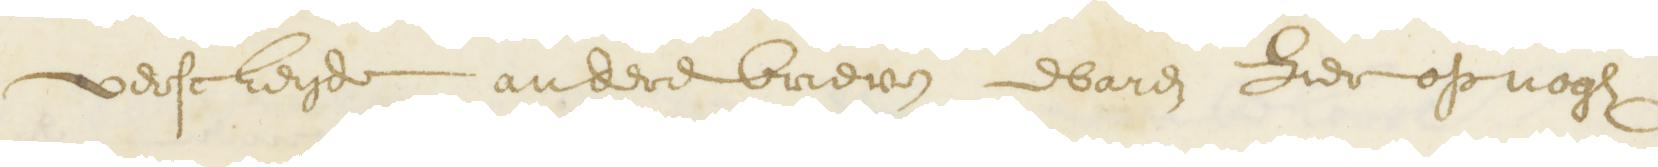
verscheijde andere brieven waren hier op nogh
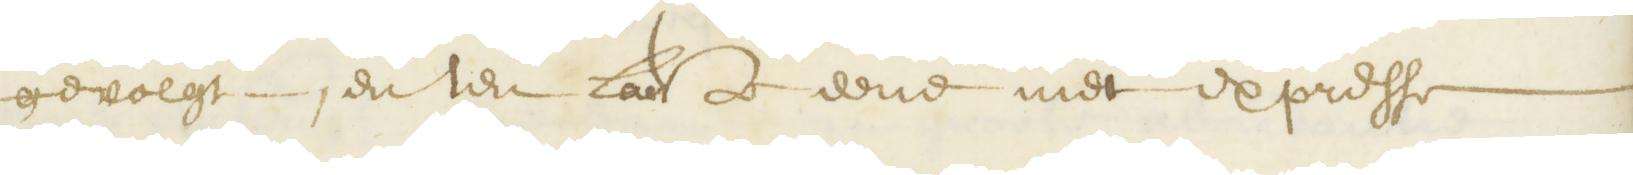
gevolgt, en ten laeste eene met expresse
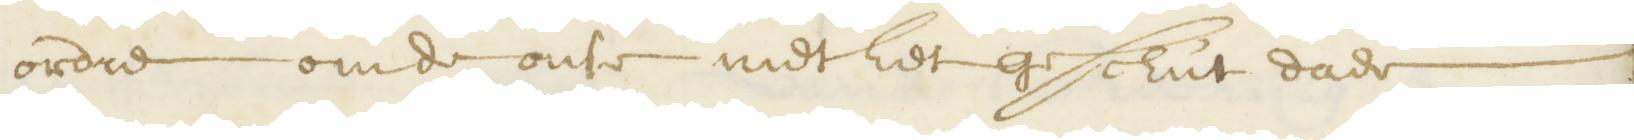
ordre om de ons met het geschut daer
